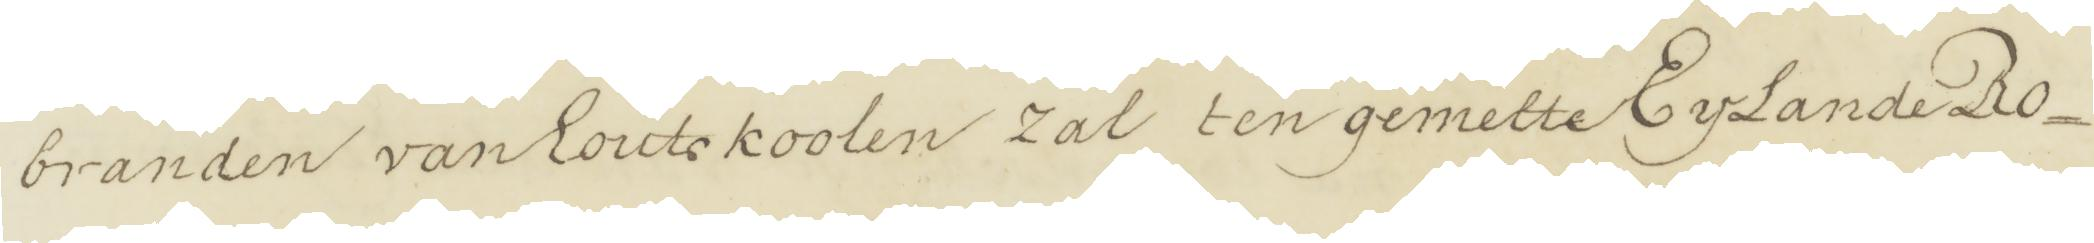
branden van houtskoolen zal ten gemelte Eylande Ro=
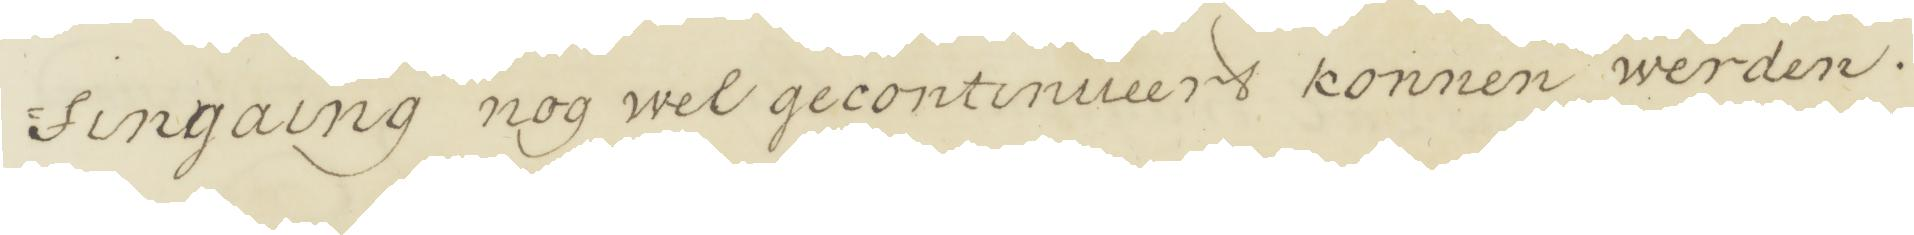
=singaing nog wel gecontinueert konnen werden
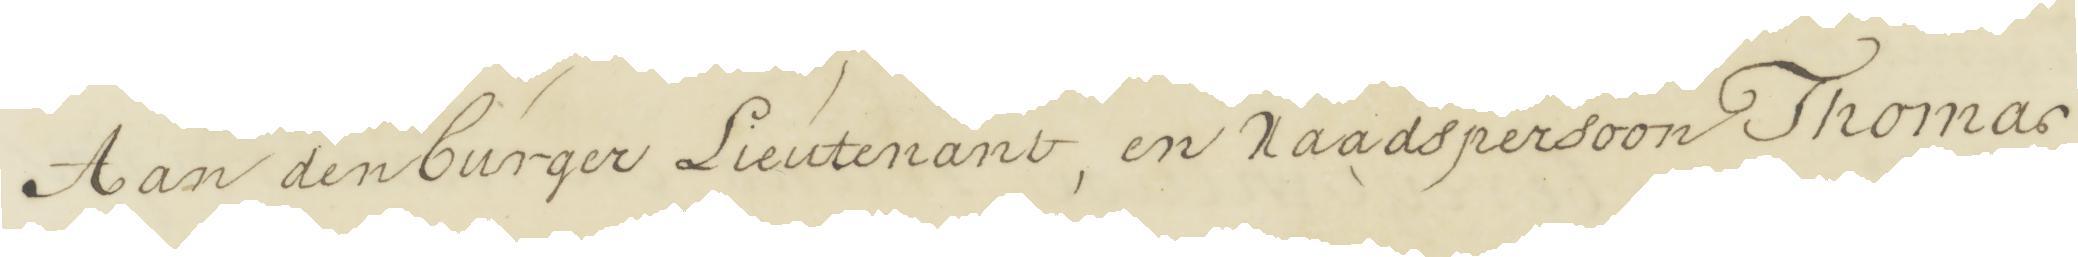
Aan den burger Lieutenant, en raads persoon Thomas
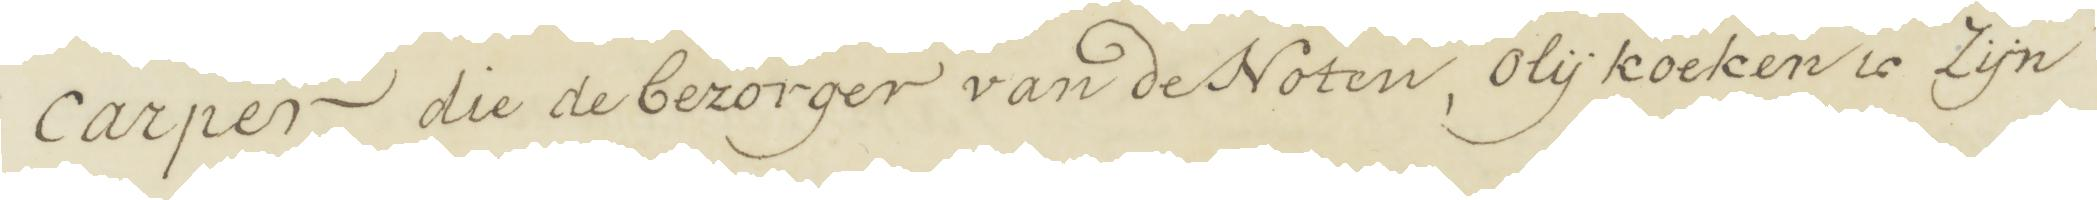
carper, die de bezorger van de Noten, olij koeken is zijn
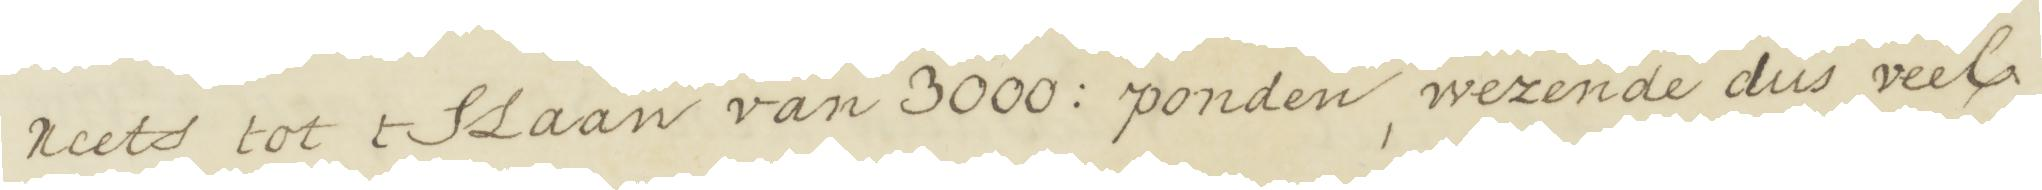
reets tot 't slaan van 3000: ponden, wezende dus veel
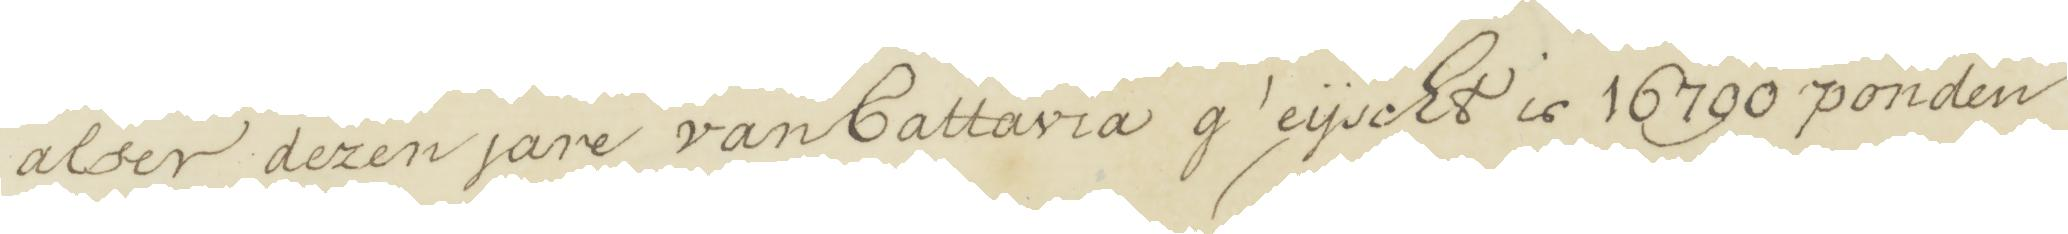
als er dezen jare van battavia g’eijscht is 16790 ponden
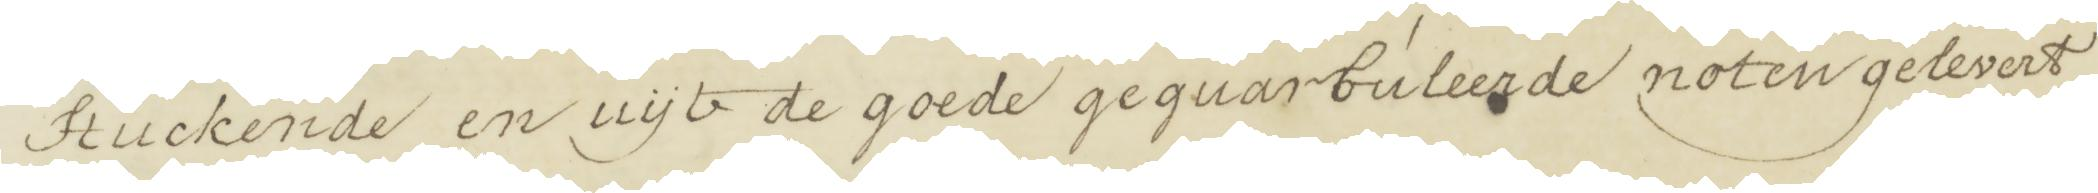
stuckende en uijt de goede geguarbuleerde noten gelevert,
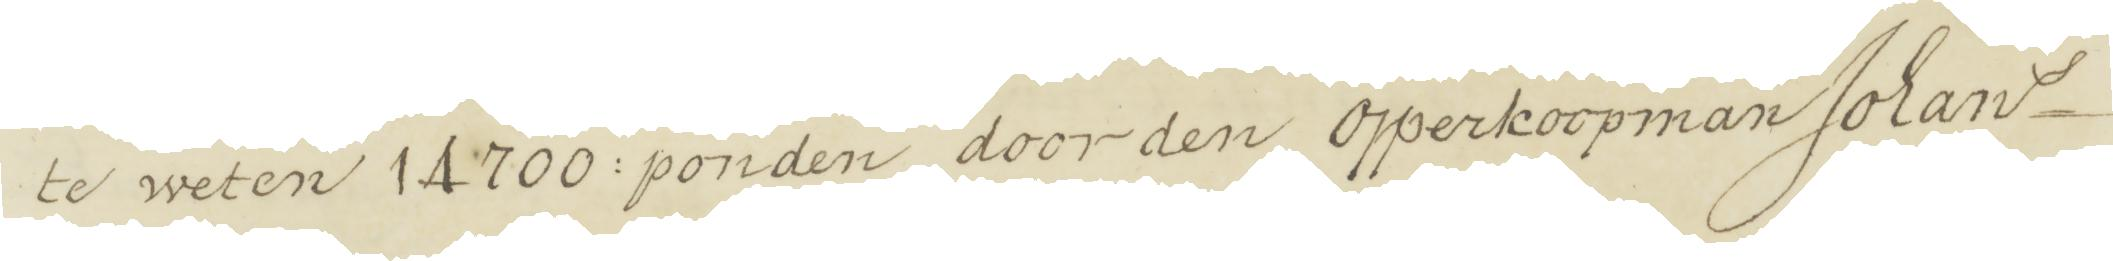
te weten 14700: ponden, door den opperkoopman Johan=s
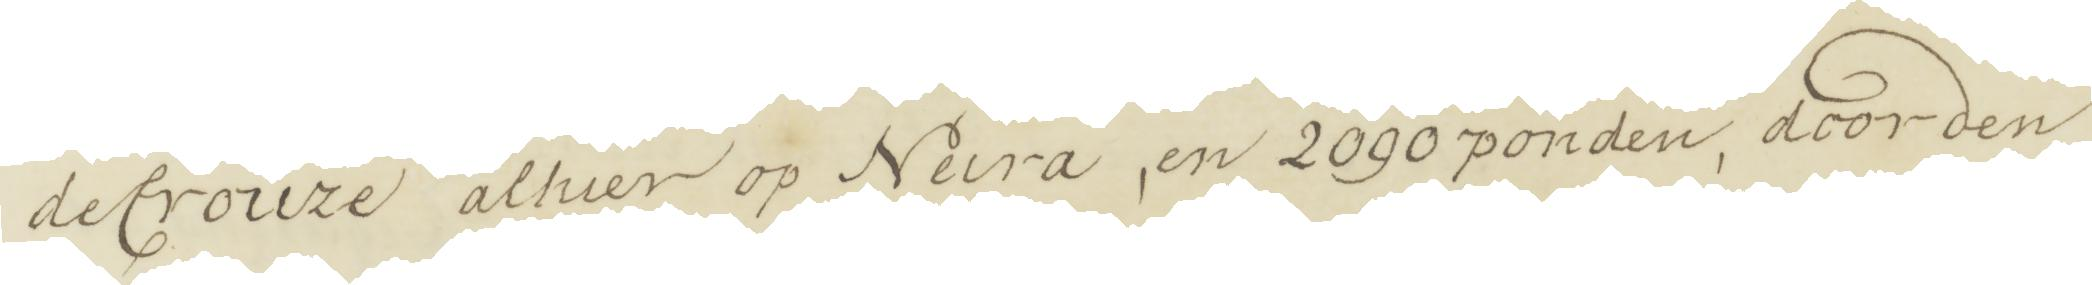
de Crouze alhier op Neira, en 2090 ponden, door den
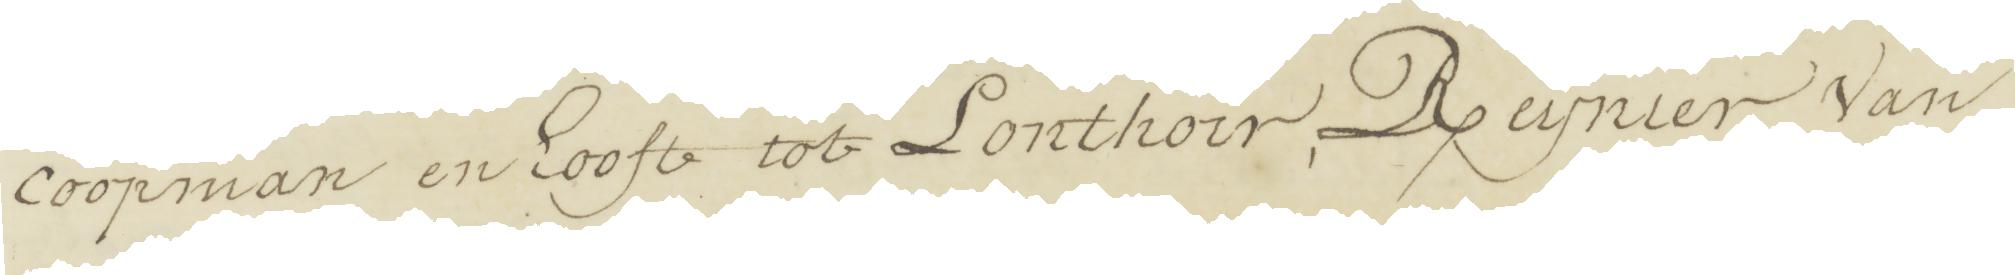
coopman en hoofte tot Lonthoir, Reijnier van
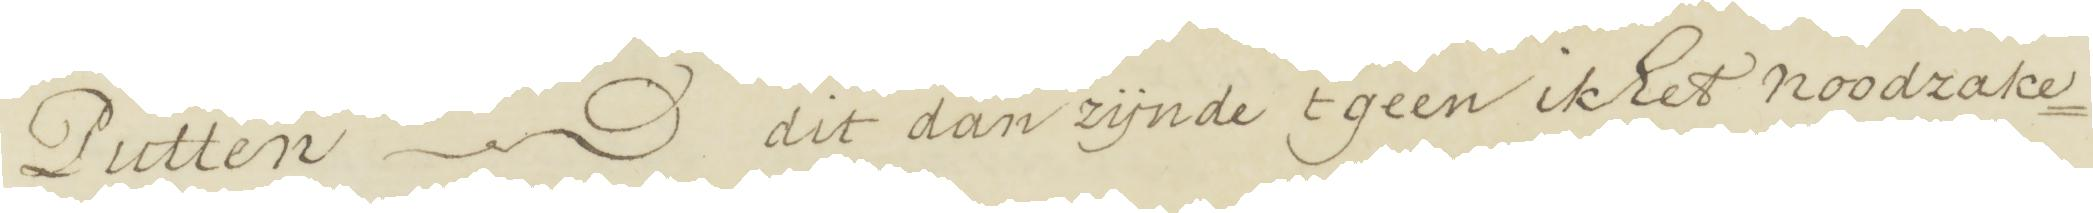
Putten en dit dan zijnde t geen ik het noodzake=
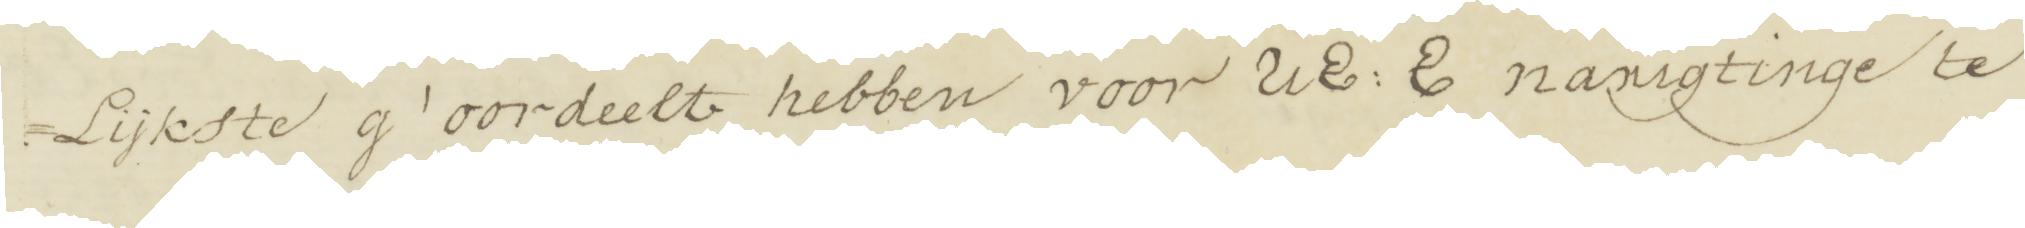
=Lijkste g’oordeelt hebben voor UE: E narigtinge te
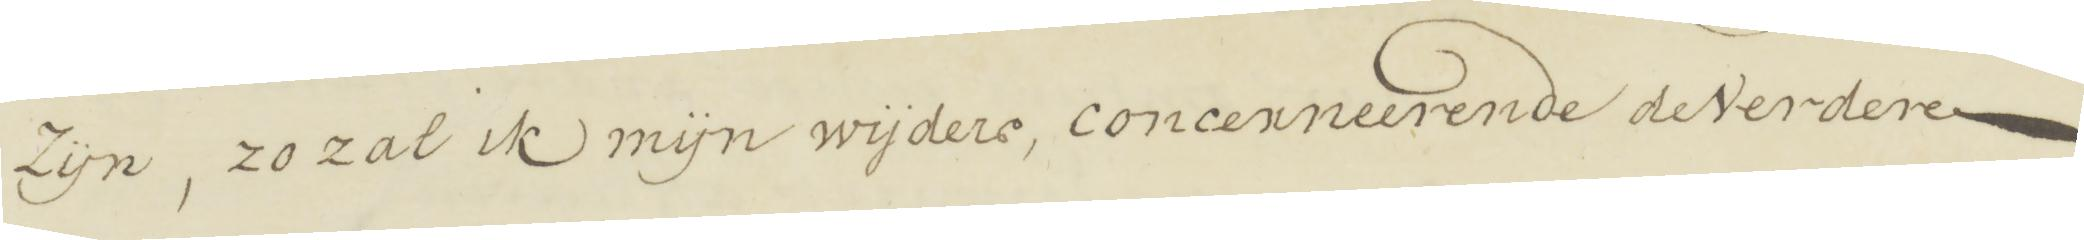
zijn, zo zal ik mijn wijders, concerneerende de verderen
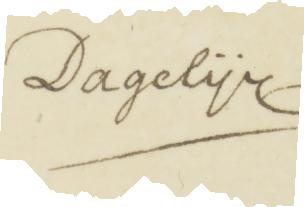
Dagelijx
